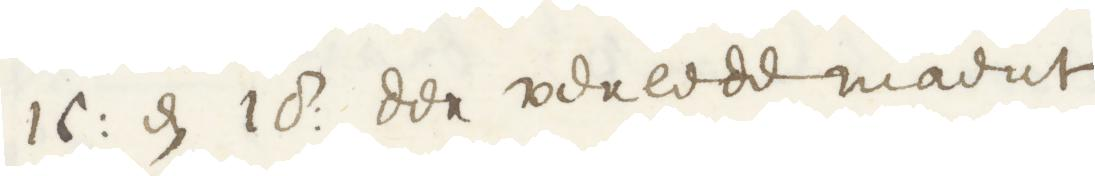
15: en 18: der verlede maent
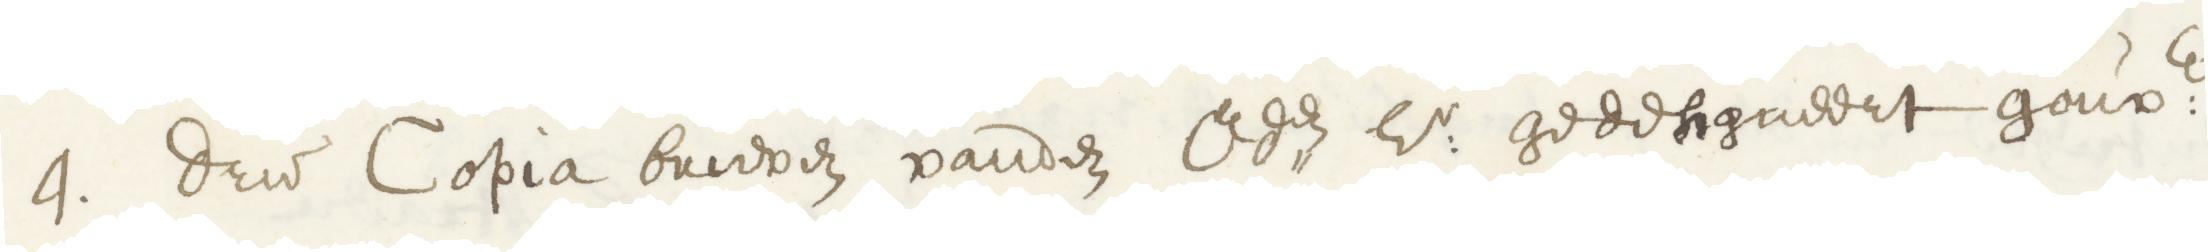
4. drie Copia brieven vanden Ed„en h:r gedesigneert gouv:r
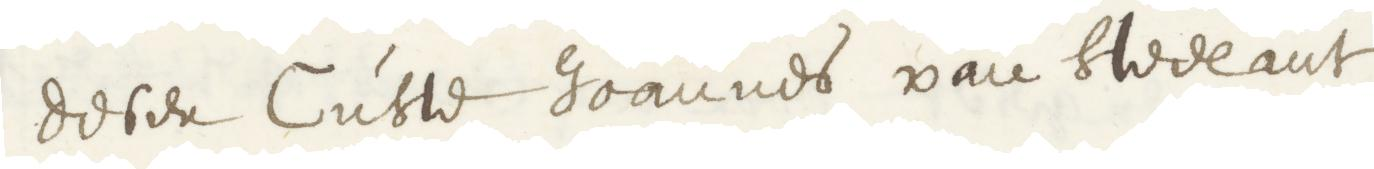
deser Custe Ioannes van steelant
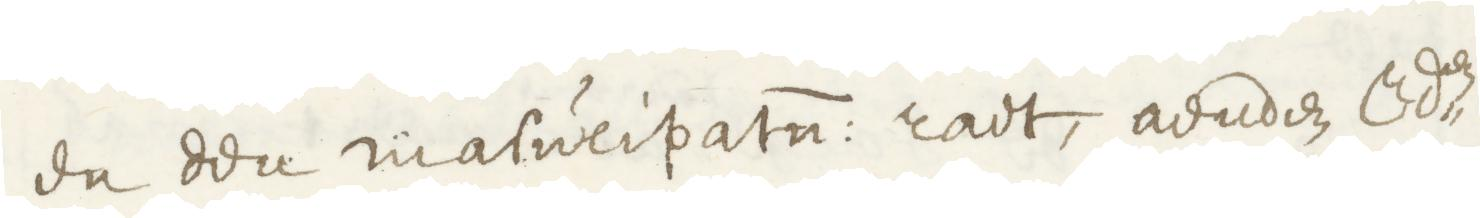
en den masulipatn: raet, aenden Ed„en
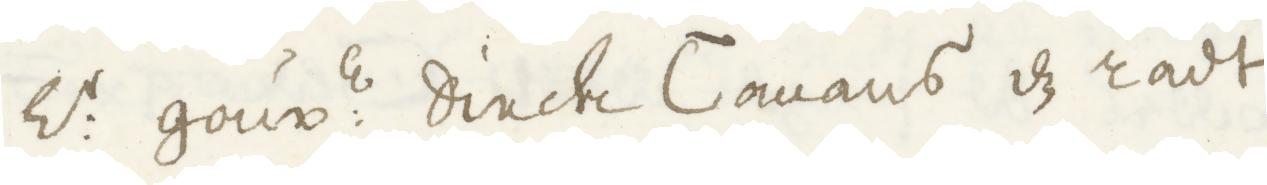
h:r gouv:r dirck Comans en raet
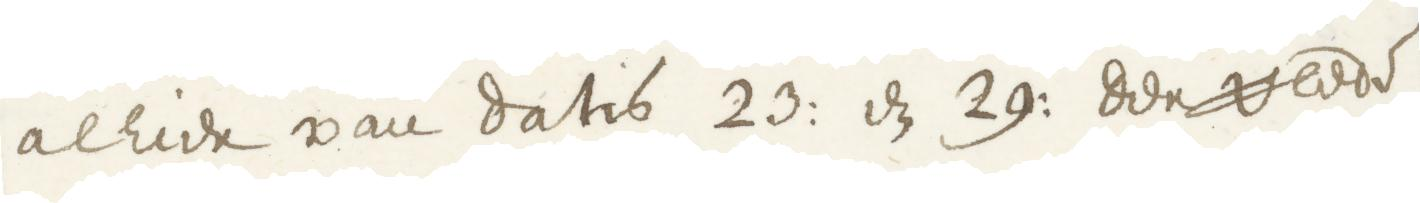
alhier van datis 23: en 29: der verlede
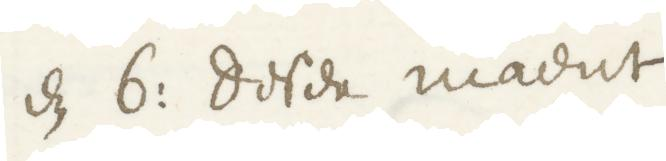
en 6: deser maent
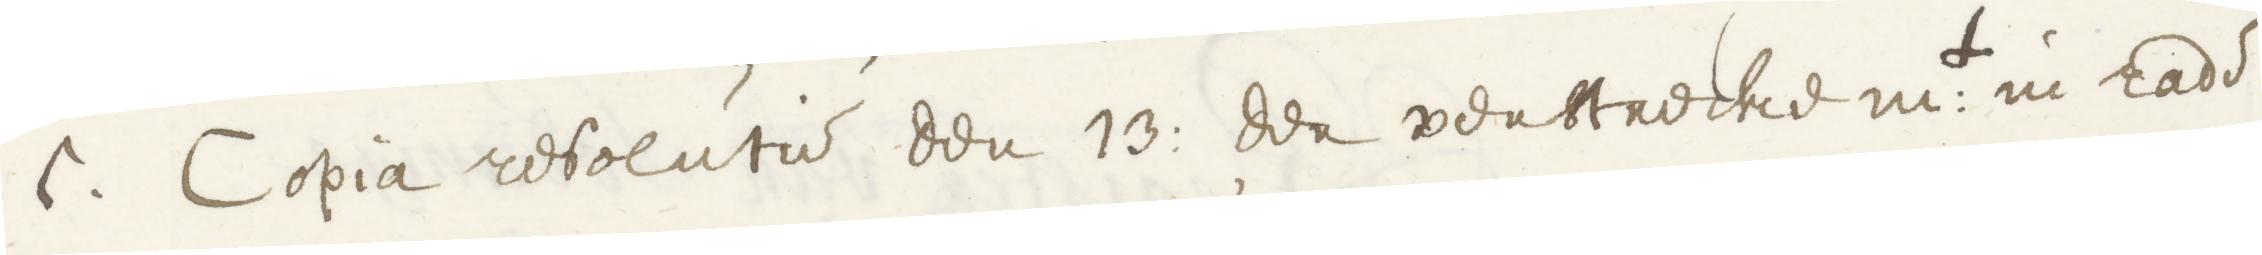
5. Copia resolutie den 13: der verstrecke m:t in rade
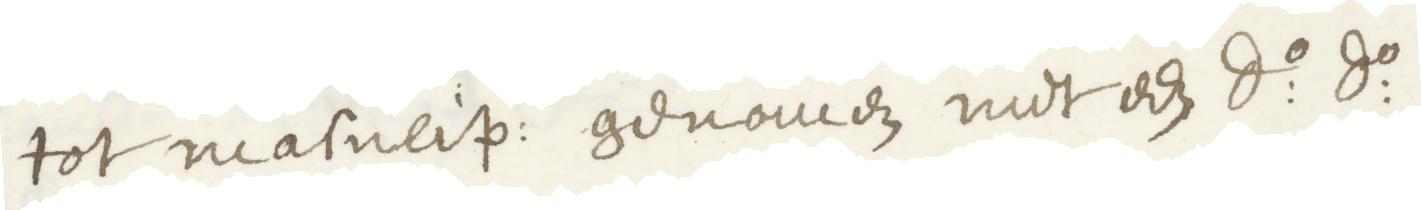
tot masulip: genomen met een d:o d:o
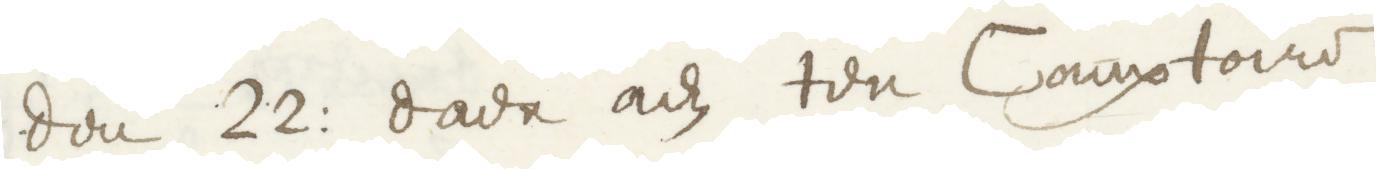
den 22: daer aen ten Comptoire
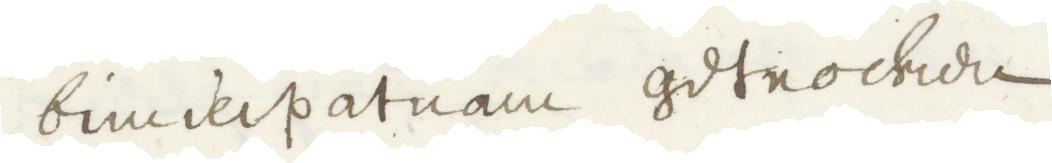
binulipatnam getrocken
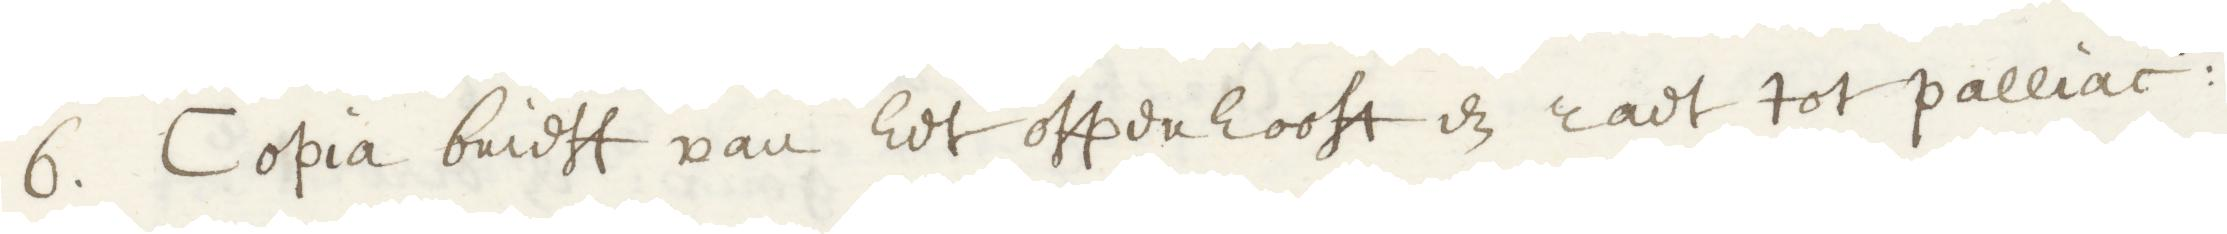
6. Copia brieff van het opperhooft en raet tot palliac:ta
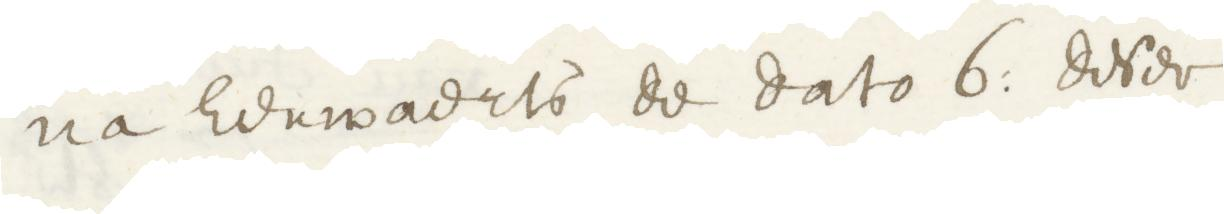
na herwaerts de dato 6: deser
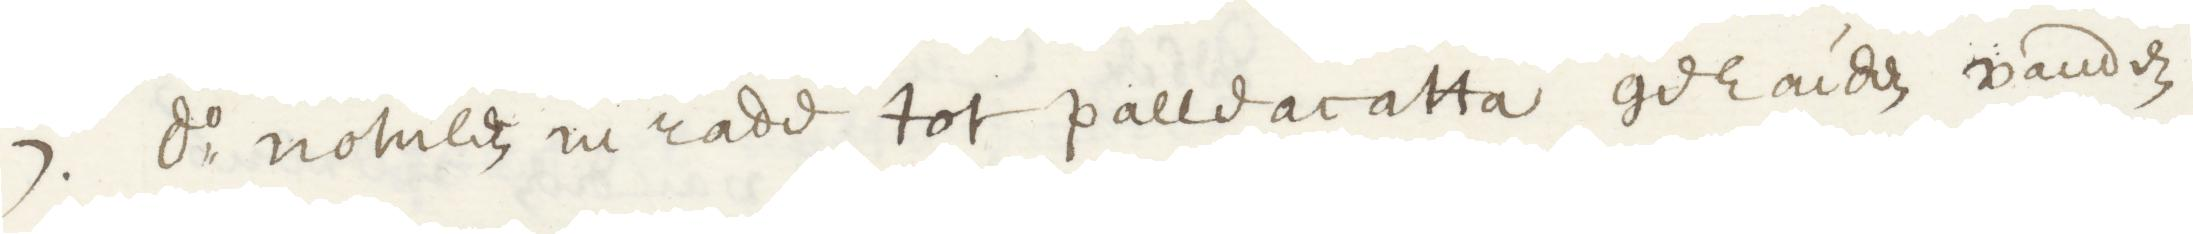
7. d„o notulen in rade tot palleacatta gehouden vanden
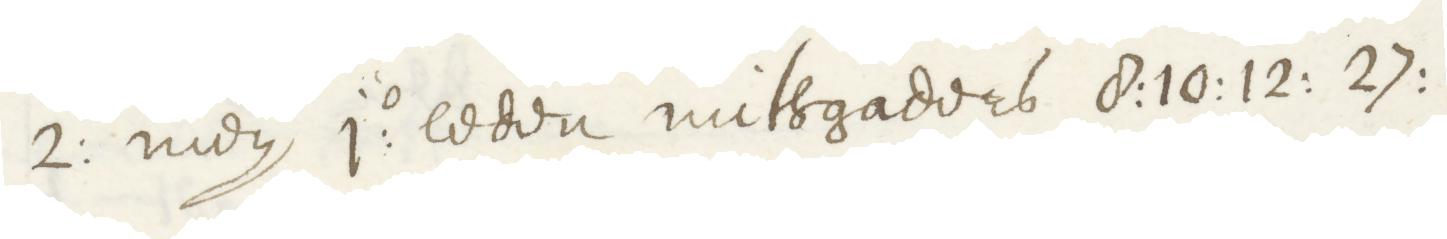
2: meij j:o leden mitsgaders 8:10:12: 27:
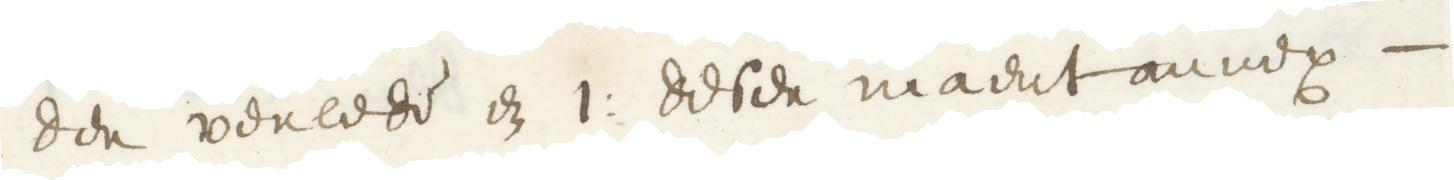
der verlede en 1: deser maent annex —
